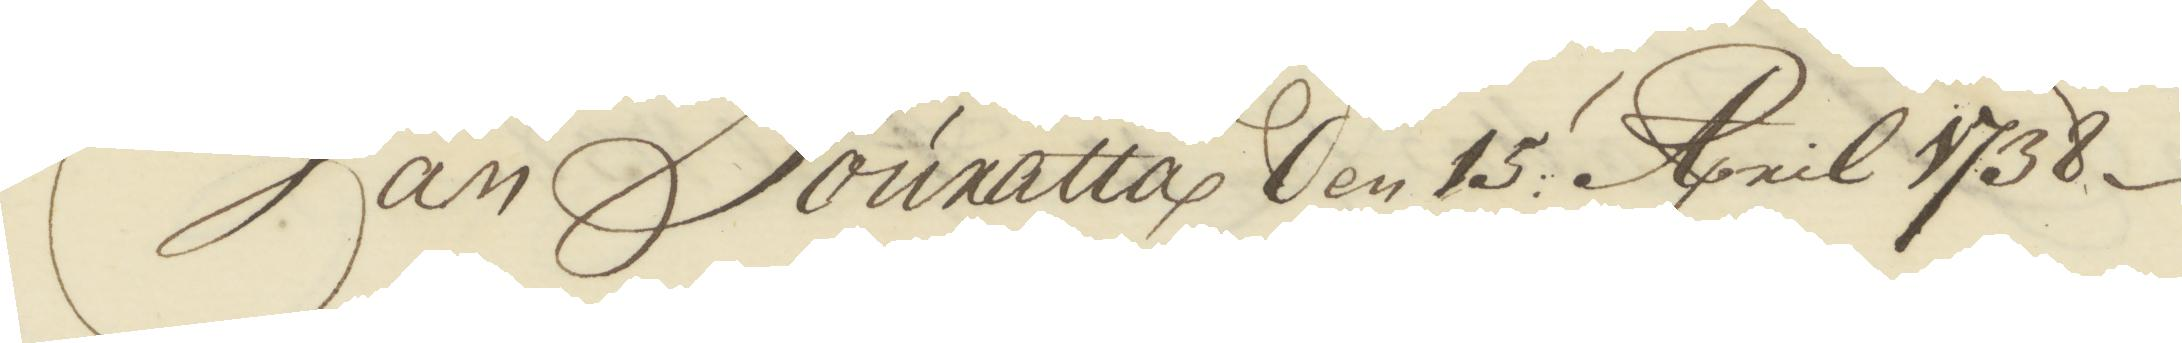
Van Souratta den 15:' April 1738.—
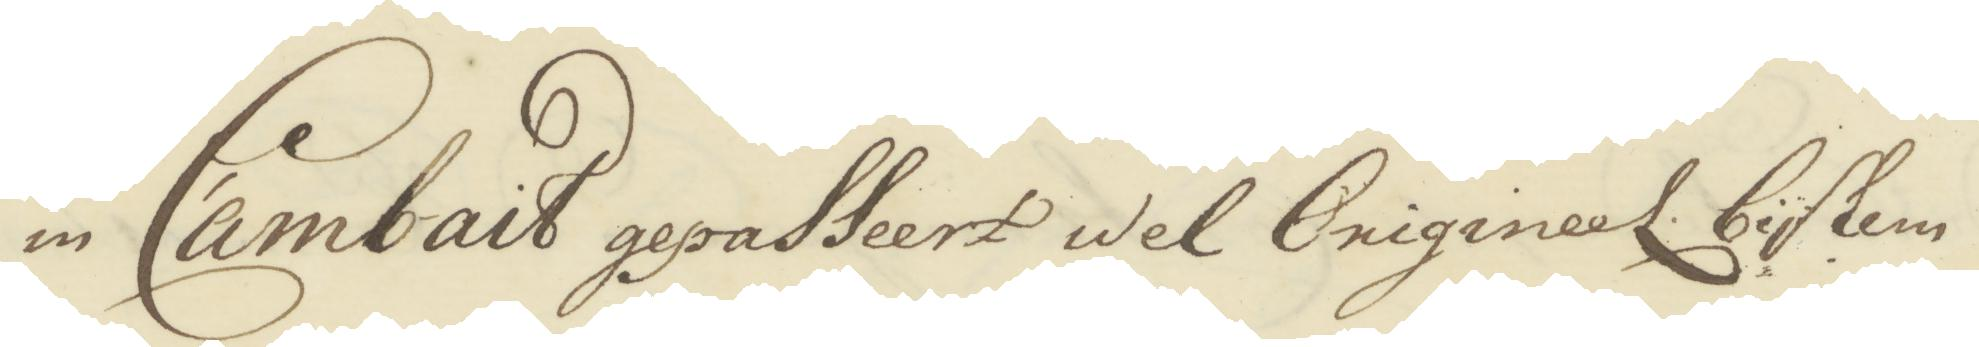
in Cambait gepasseert wel Origineel bij hem
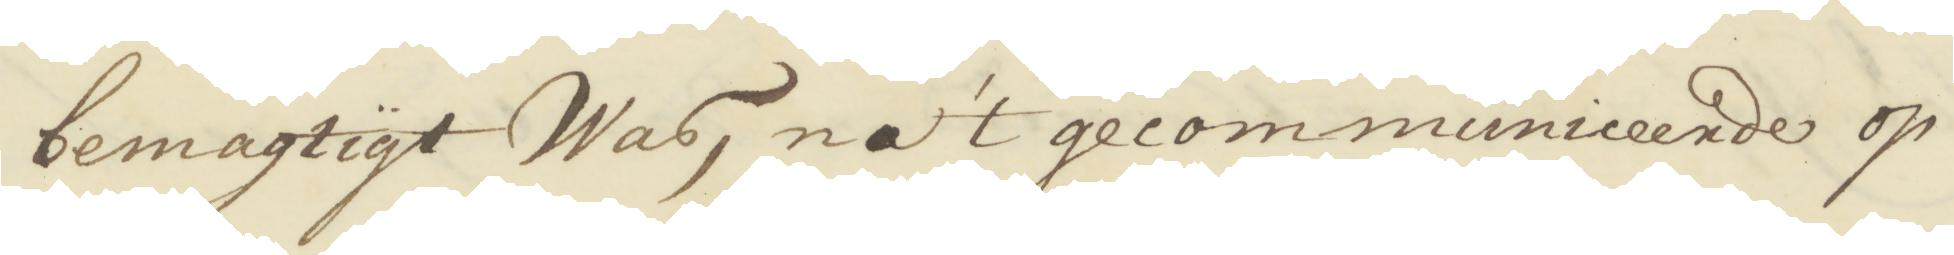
bemagtigt Was, na ’t gecommuniceerde op
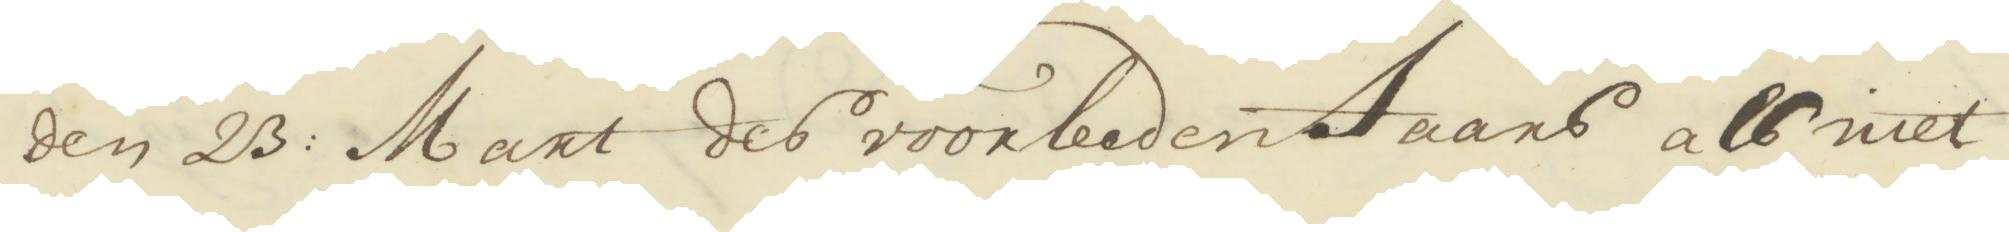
den 23: Mart des voorleeden Iaars als niet
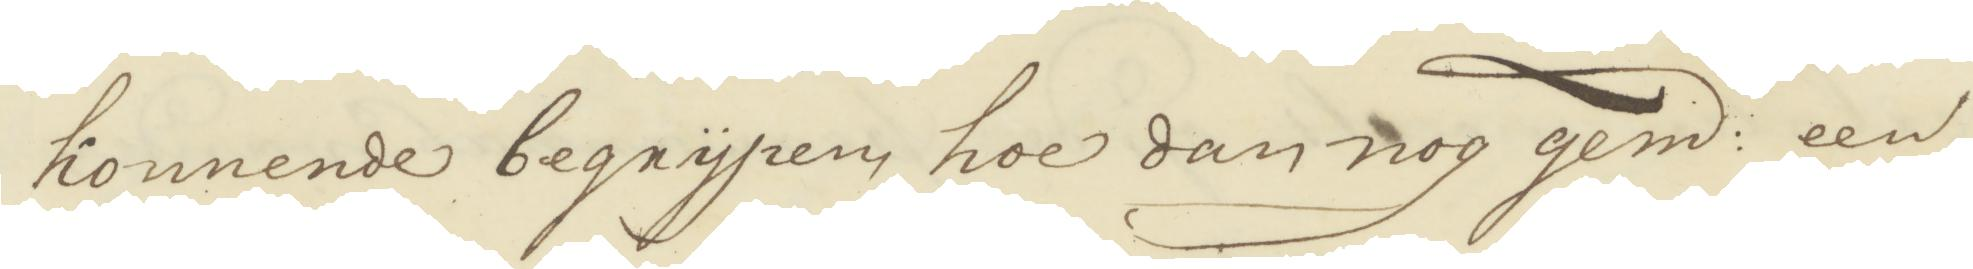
konnende begrijpen, hoe dan nog gem: een
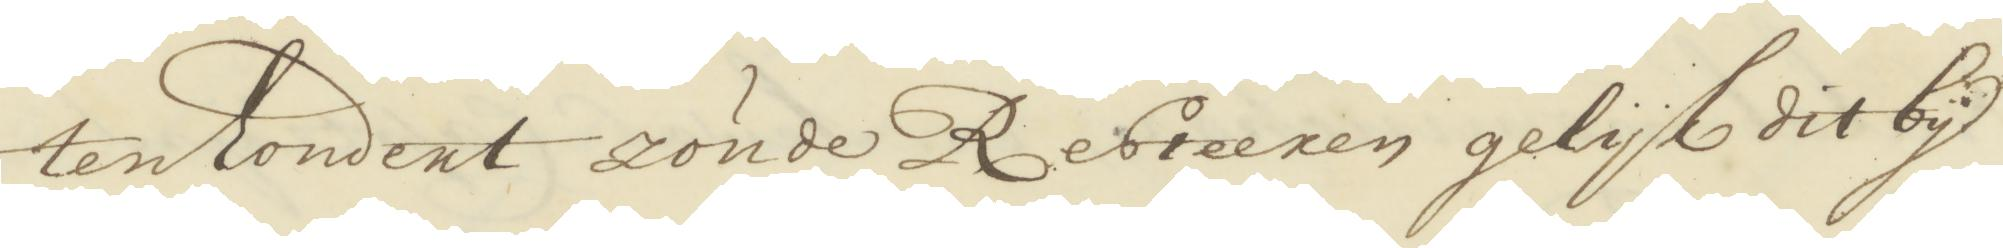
tenhondert zoude Resteeren gelijk dit bij
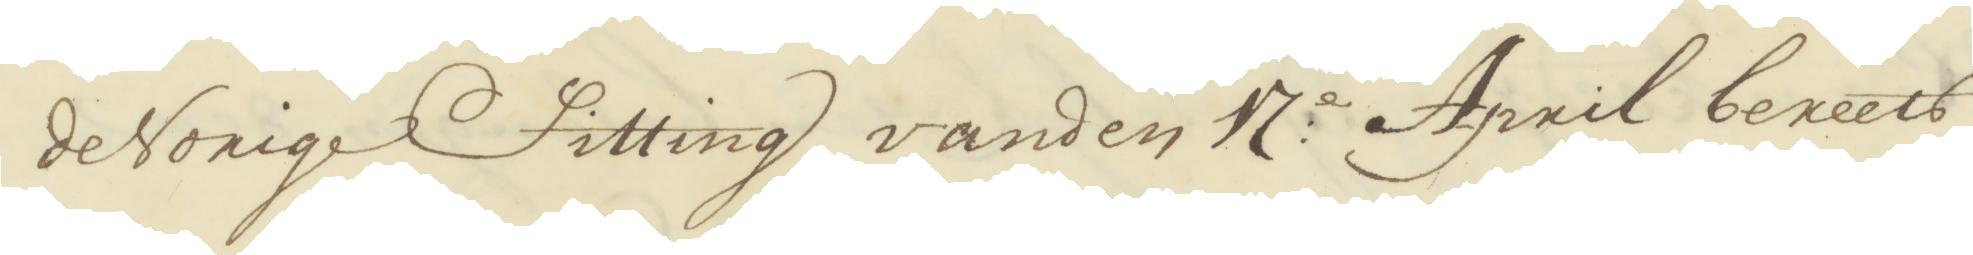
de Vorige Sitting vanden 17:e April bereets
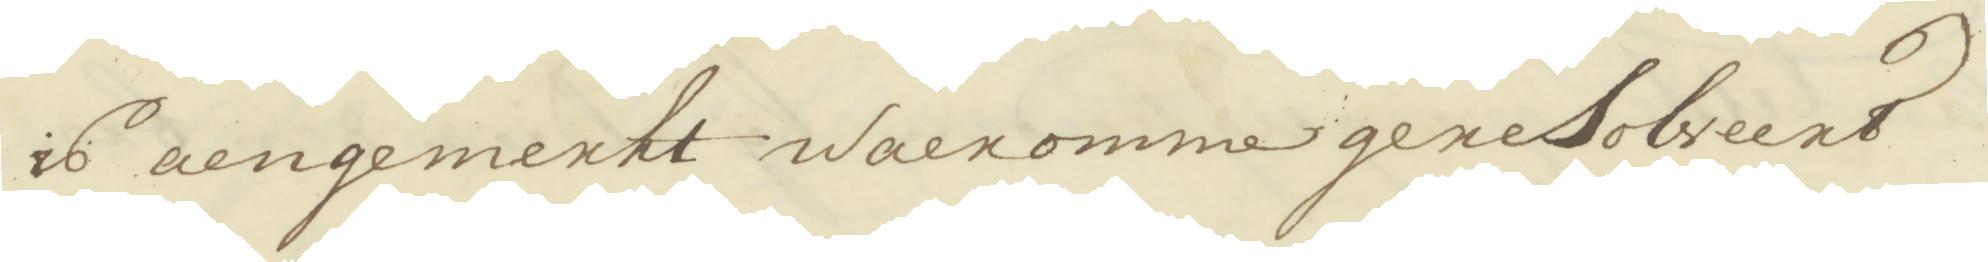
is aengemerkt waeromme geresolveert
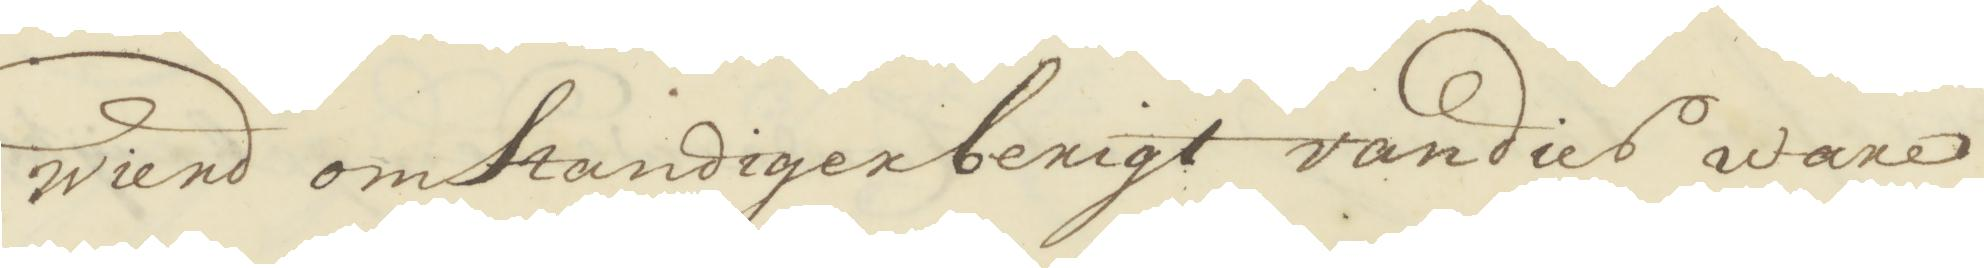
wierd omstandiger berigt van dies ware
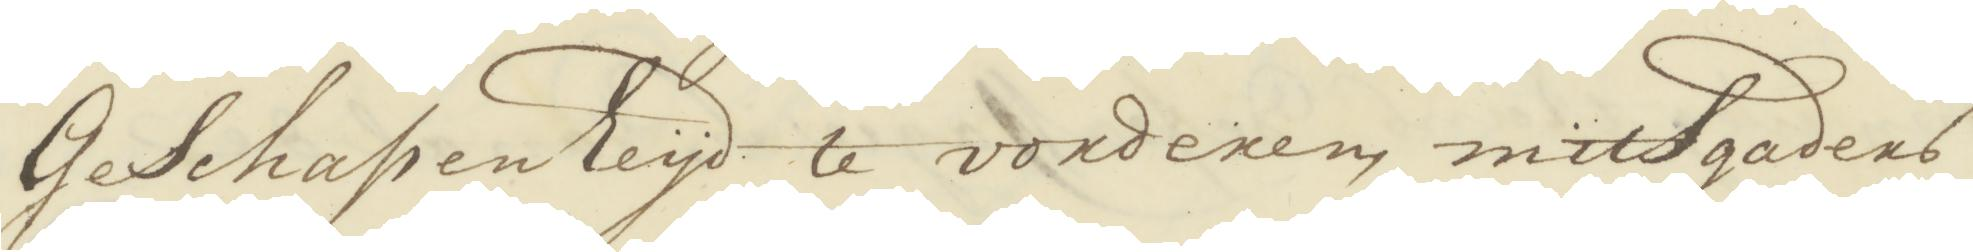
Geschapenheijd te vorderen, mitsgaders
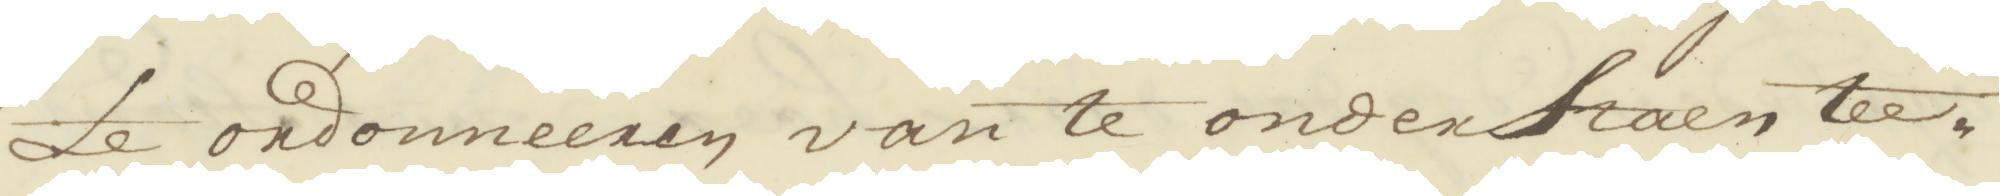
te ordonneeren van te onderstaen tee„
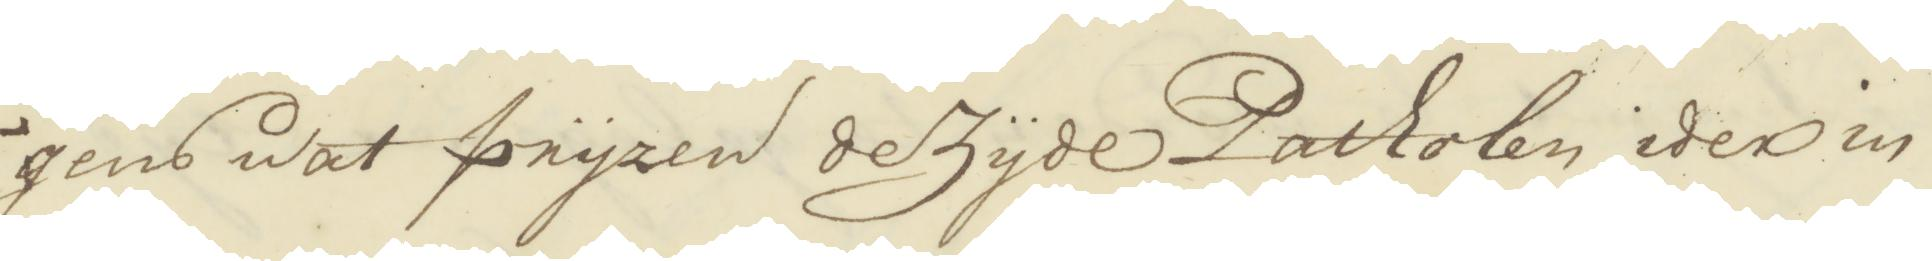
gens wat prijzen de Zijde Patholen ider in
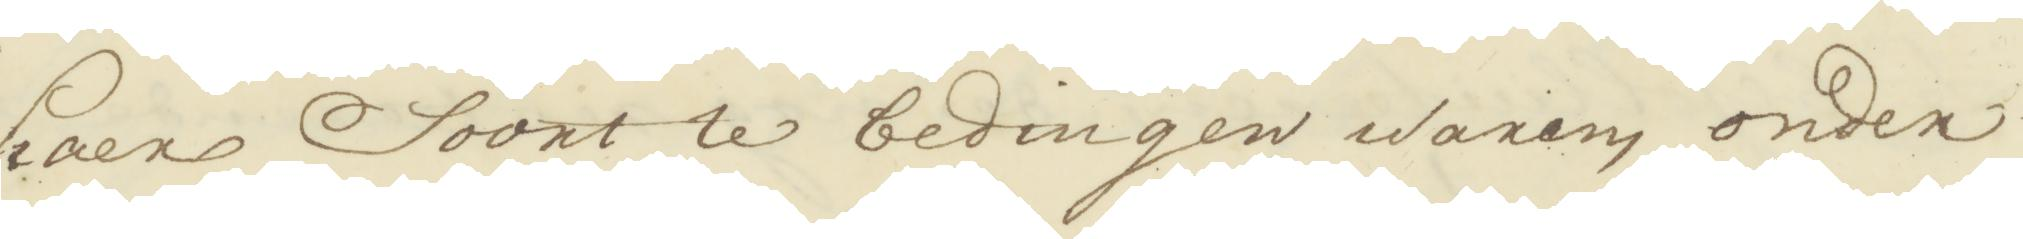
haer soort te bedingen waren, onder
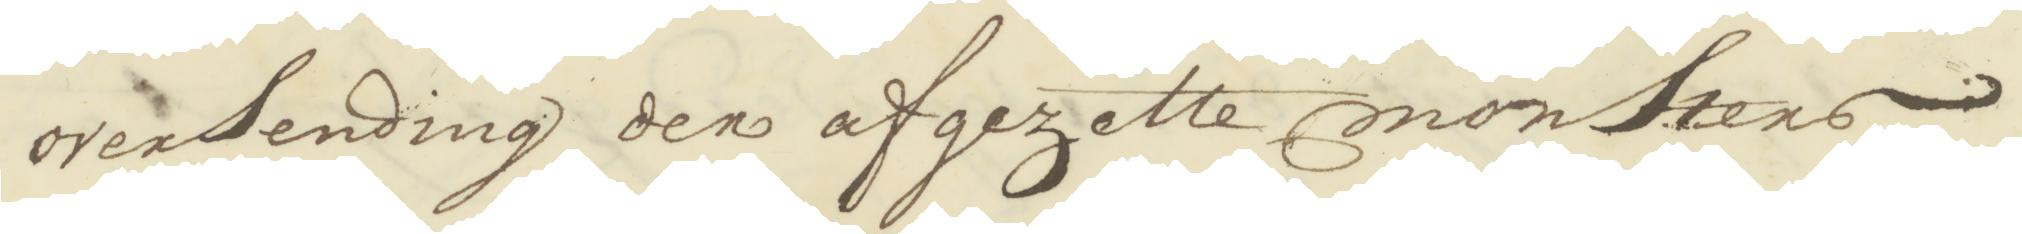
oversending der afgezette monsters
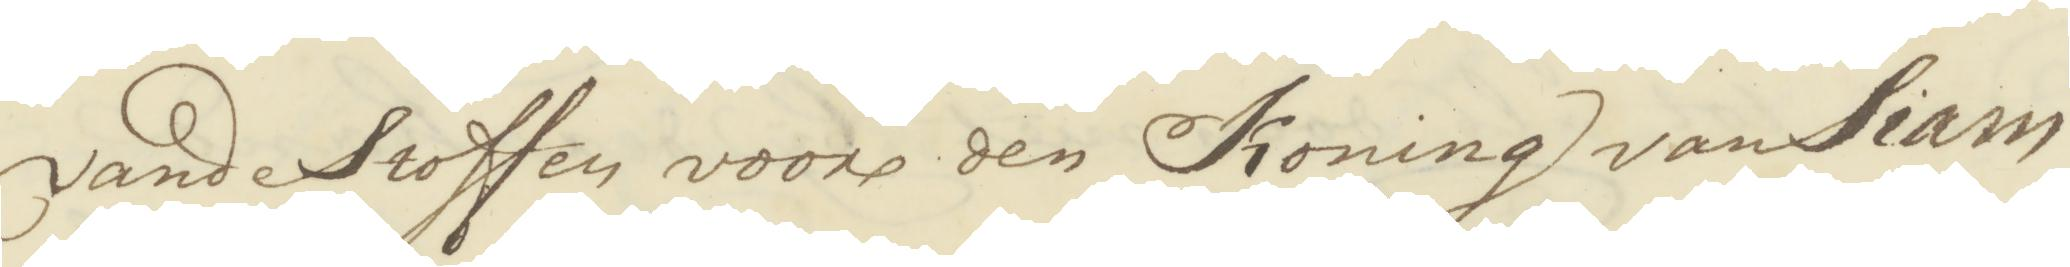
vande stoffen voor den Koning van Siam,
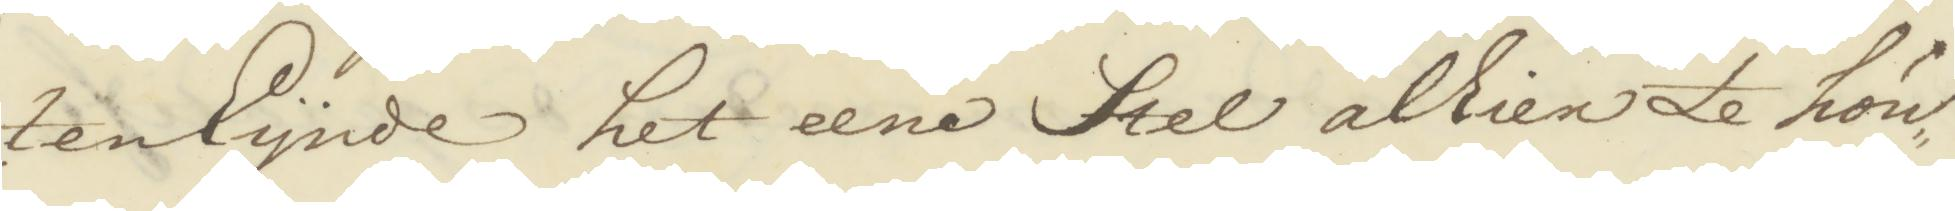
ten Eijnde het eene stel alhier te hou„
